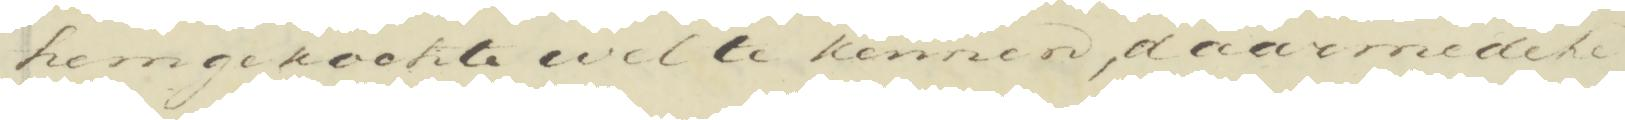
hem gekochte wel te kennen, daarmede te
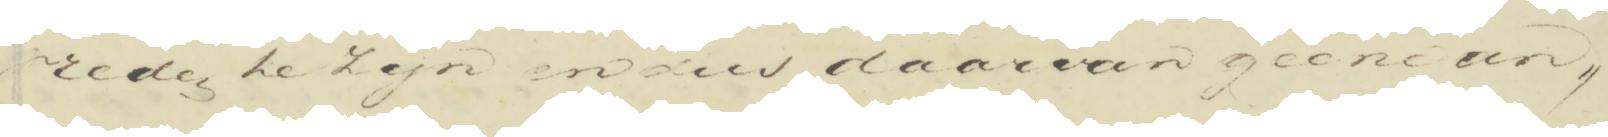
vreden te zyn en dus daarvan geene an„
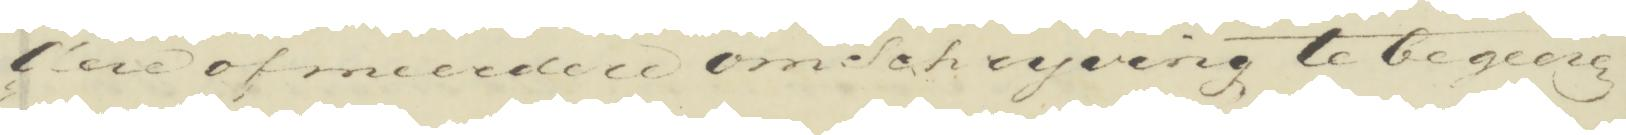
dere of meerdere omschryving te begeeren
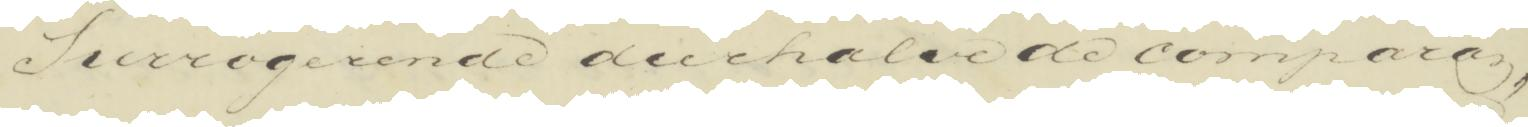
Surrogerende dierhalve de comparan
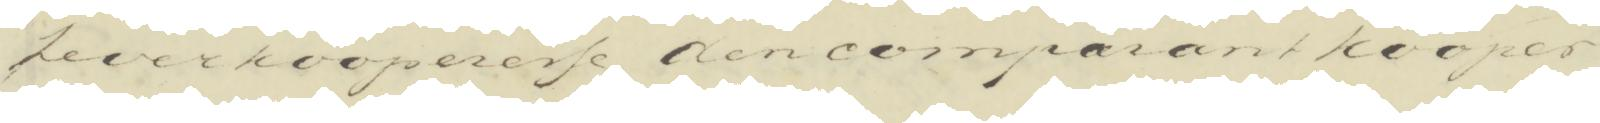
te verkooperesse den comparant kooper
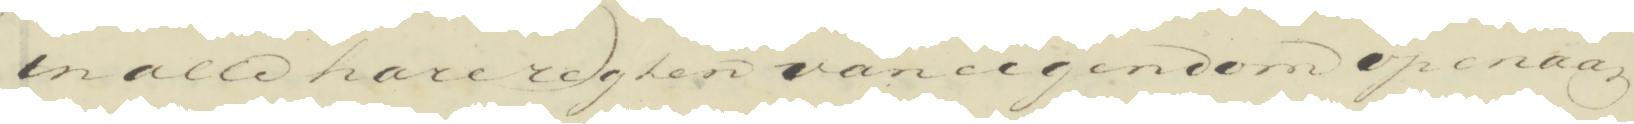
in alle hare regten van eigendom op en aan
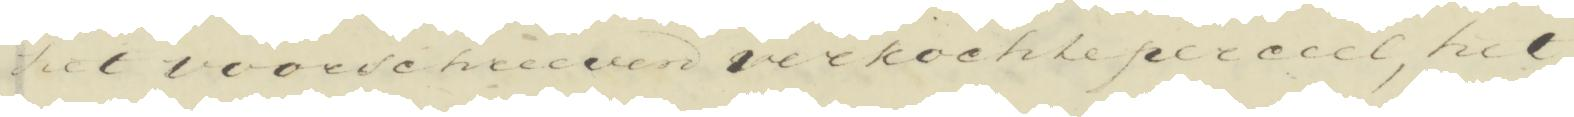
het voorschreeven verkochte perceel, het
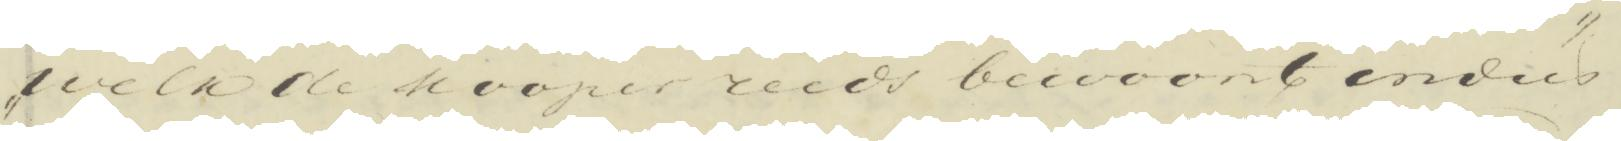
„welk de kooper reeds bewoont en dus
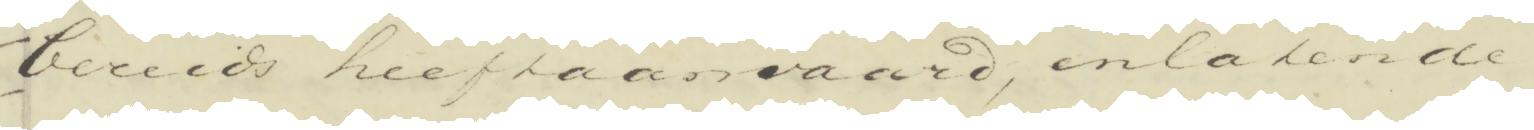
bereids heeft aanvaard, en latende
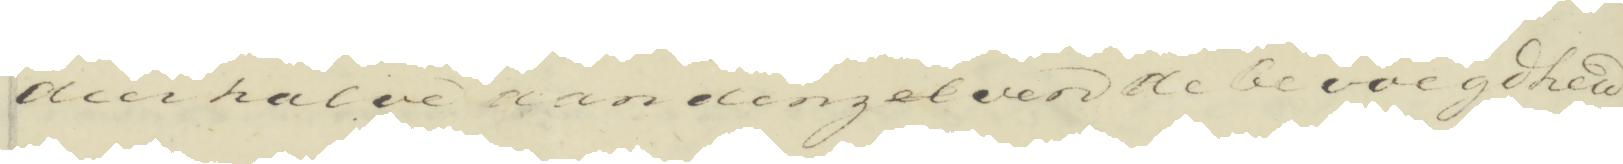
dier halve aan denzelven de bevoegdheid
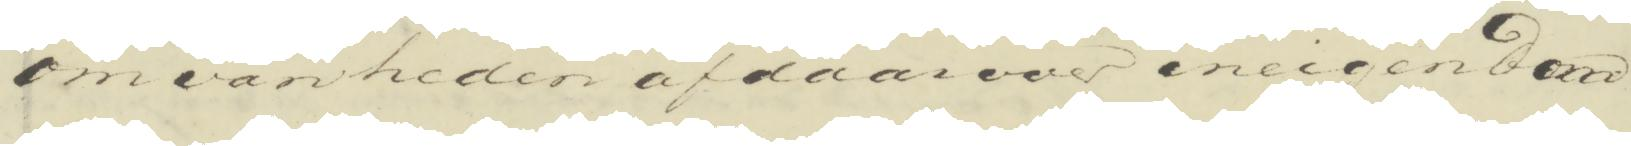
om van heden af daar ook in eigendom
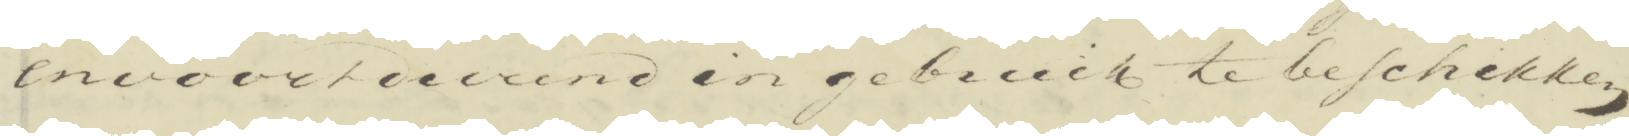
en voortdurend in gebruik te beschikken
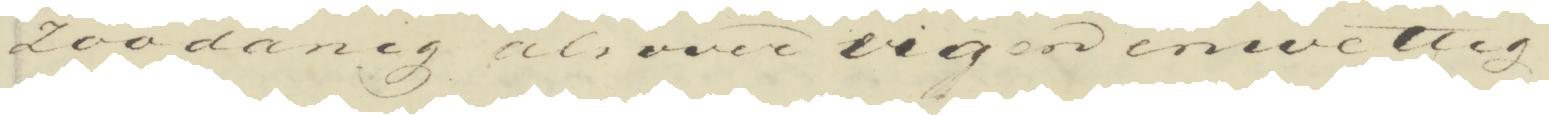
zoodanig als over eigen en wettig
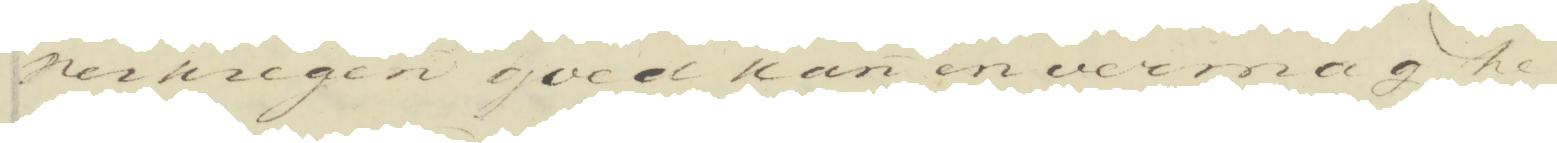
verkregen goed kan en vermag, te
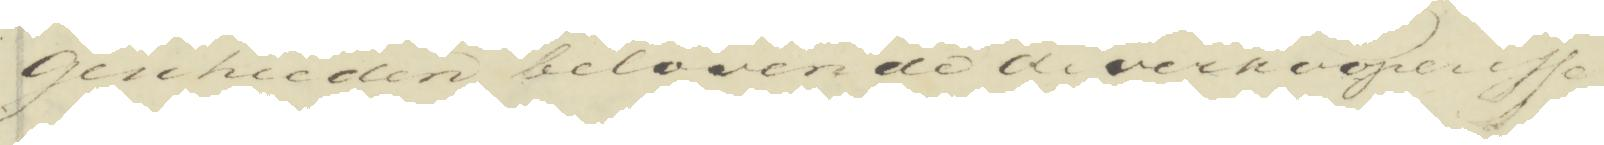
geschieden, belovende de verkooperesse
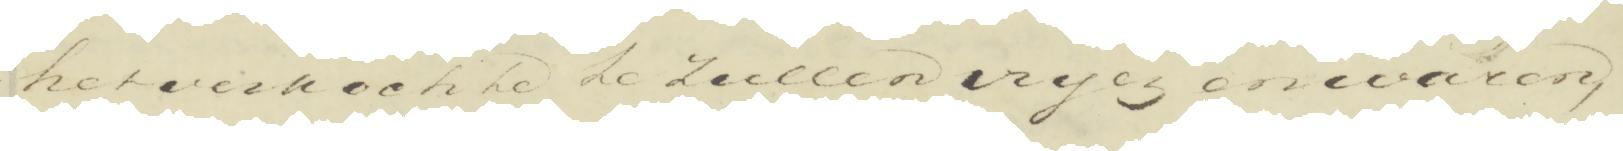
het verkochte te zullen vryen en waren,
